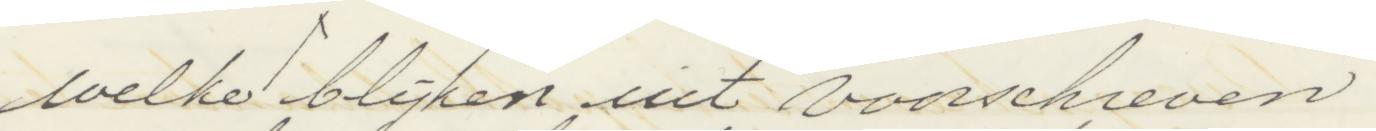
welke ¶ blijken uit voorschreven
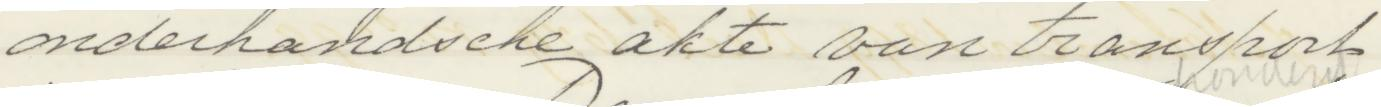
onderhandsche akte van transport
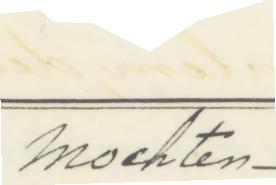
mochten
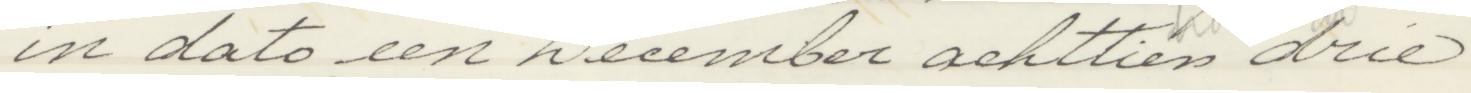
in dato een December achttien honderd drie
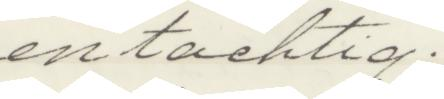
en tachtig;
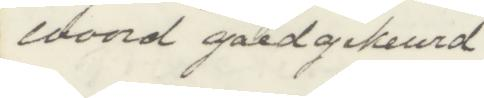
woord goedgekeurd
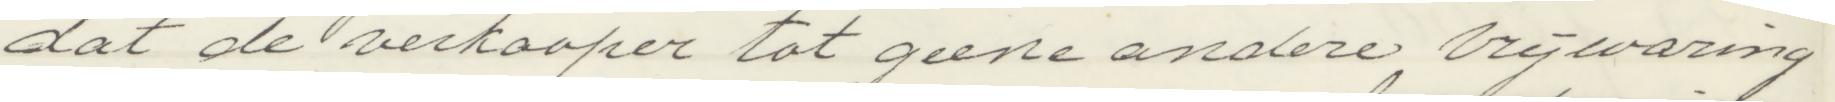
dat de verkooper tot geene andere vrijwaring
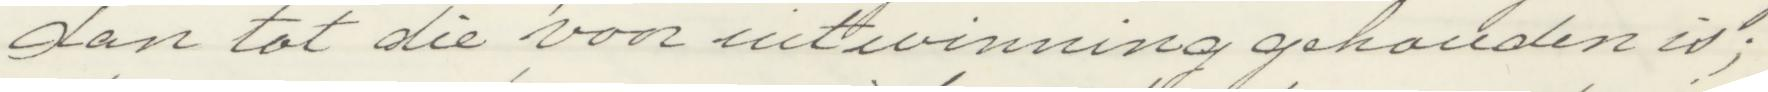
dan tot die voor uitwinning gehouden is;
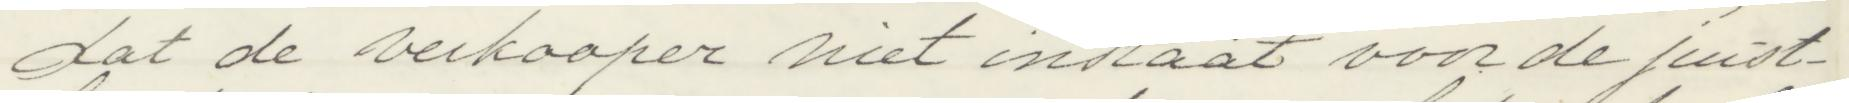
dat de verkooper niet instaat voor de juist-
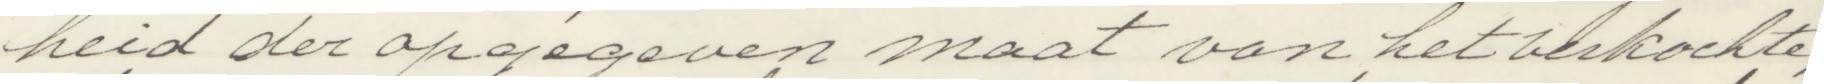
heid der opgegeven maat van het verkochte,
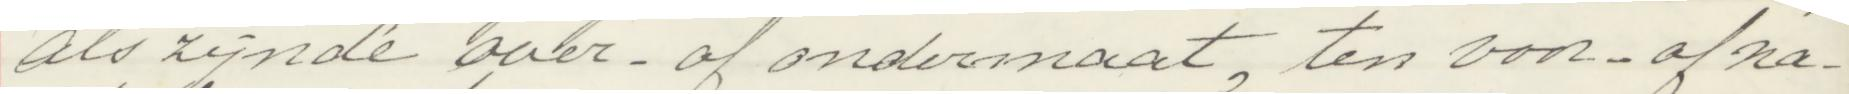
als zijnde over- of ondermaat, ten voor- of na-
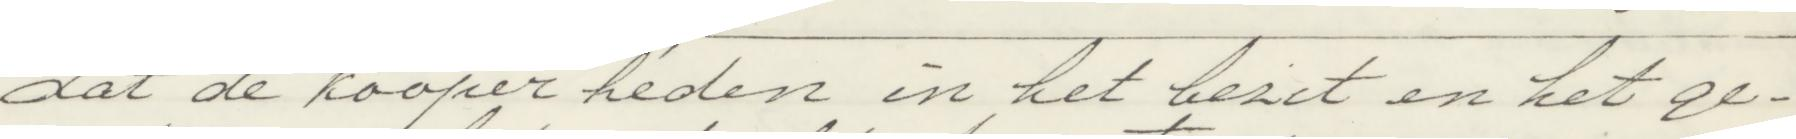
dat de kooper heden in het bezit en het ge-
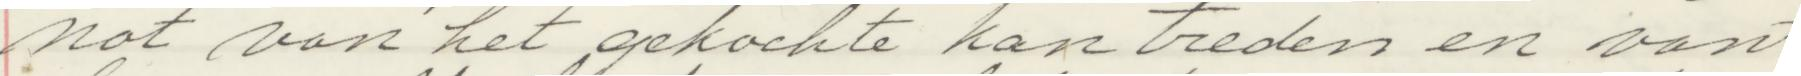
not van het gekochte kan treden en van
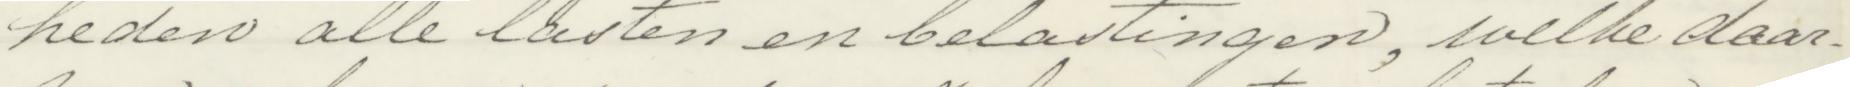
heden alle lasten en belastingen, welke daar-
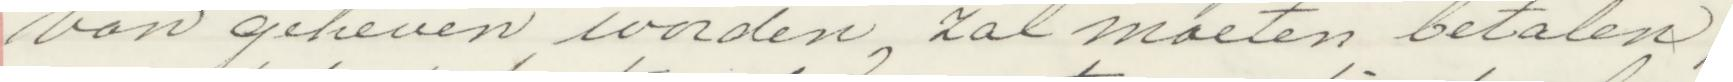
van geheven worden zal moeten betalen;
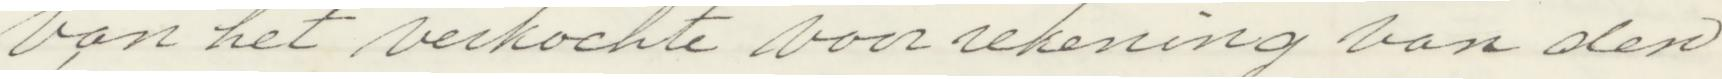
van het verkochte voor rekening van den
